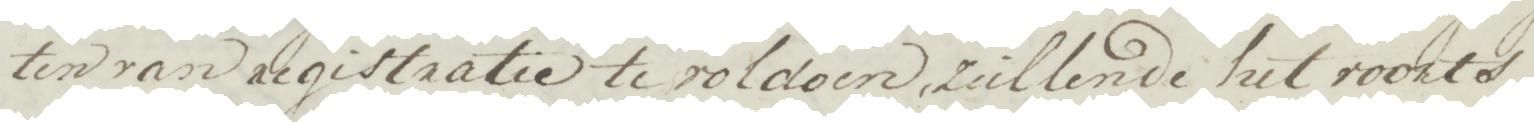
ten van registratie te voldoen, zullende het voorts
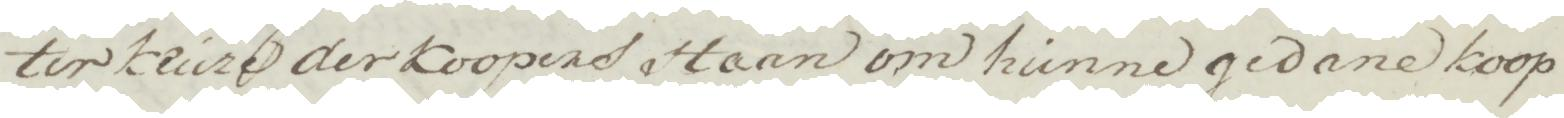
ter keuze der koopers staan om hunne gedane koop
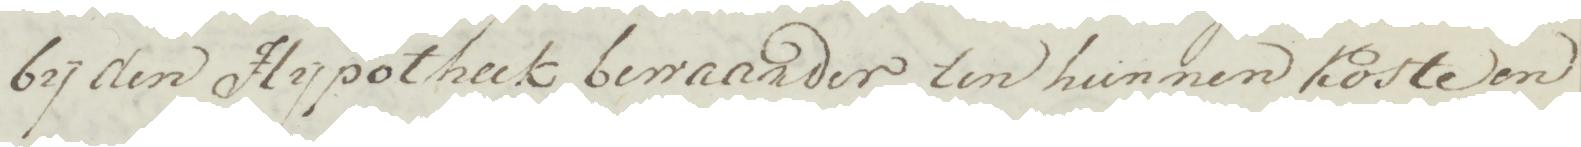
bij den Hijpotheek bewaarder ten hunnen koste en
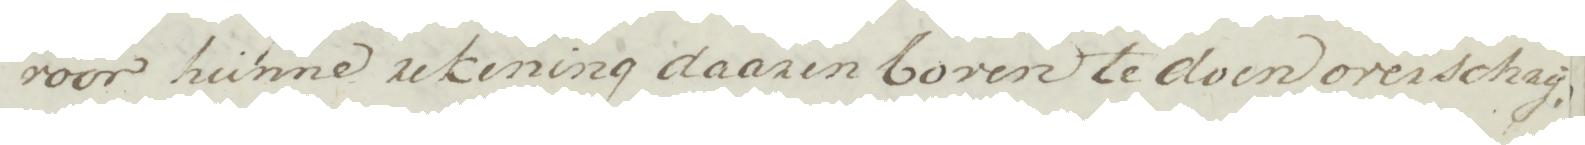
voor hunne rekening daar en boven te doen overschrij„
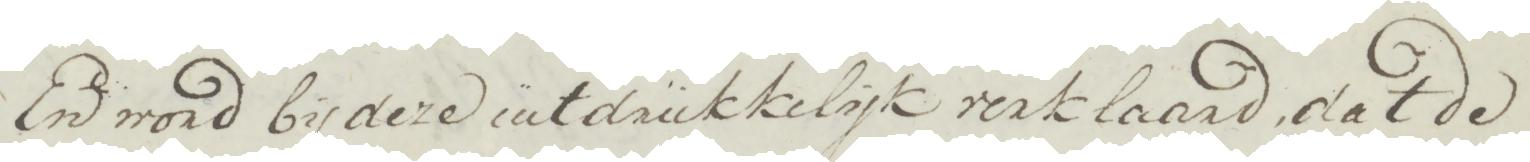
En word bij deze uitdrukkelijk verklaard, dat de
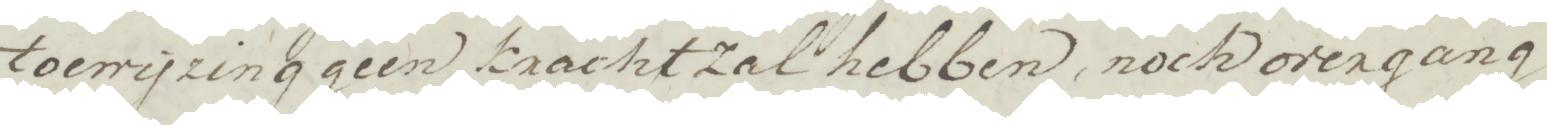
toewijzing geen kracht zal hebben, noch overgang
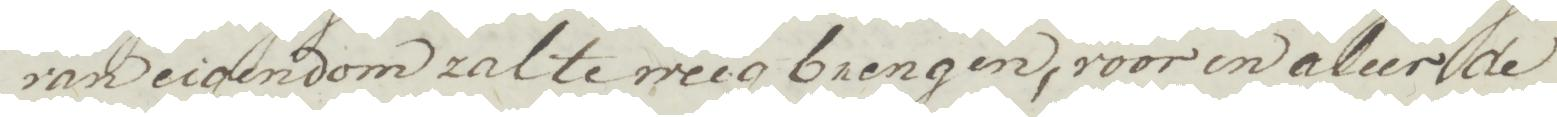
van eigendom zal te weeg brengen, voor en aleer de
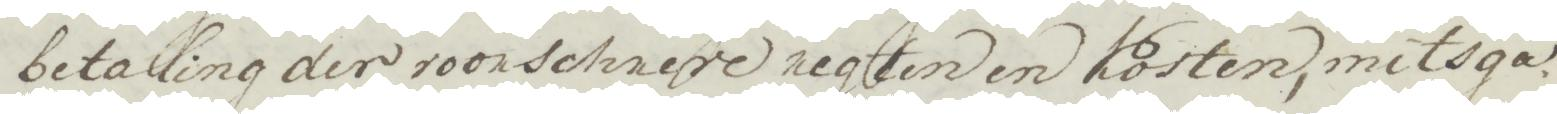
betaling der voorschreve regten en kosten, mitsga„
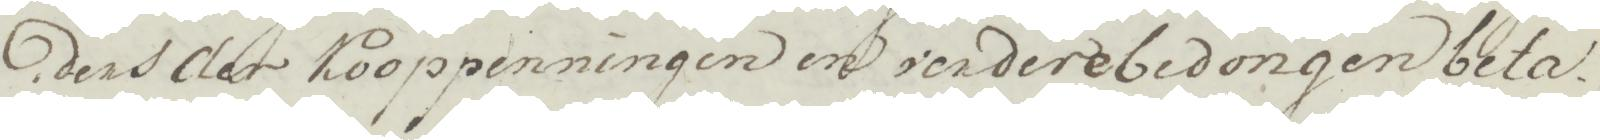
ders der kooppenningen en verdere bedongen beta„
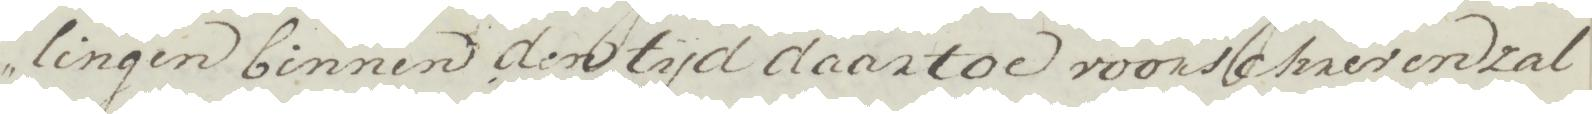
„lingen binnen den tijd daartoe voorschreven zal
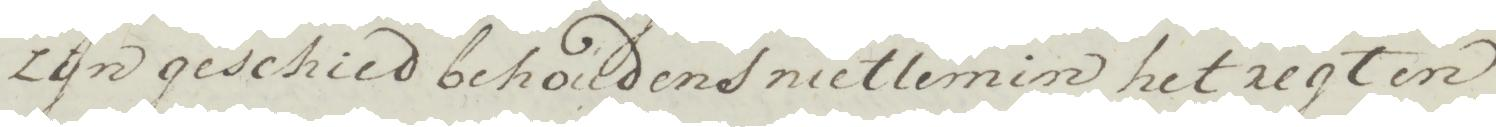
zijn geschied behoudens niettemin het regt en
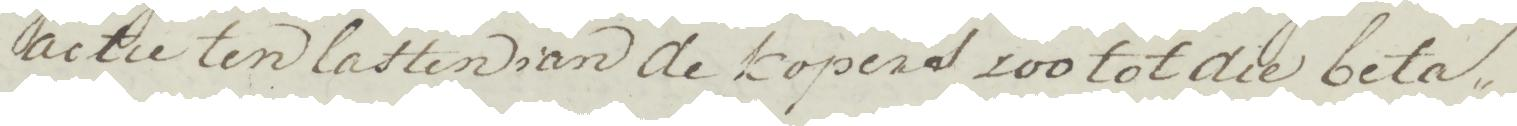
actie ten lasten van de kopers zoo tot die beta„
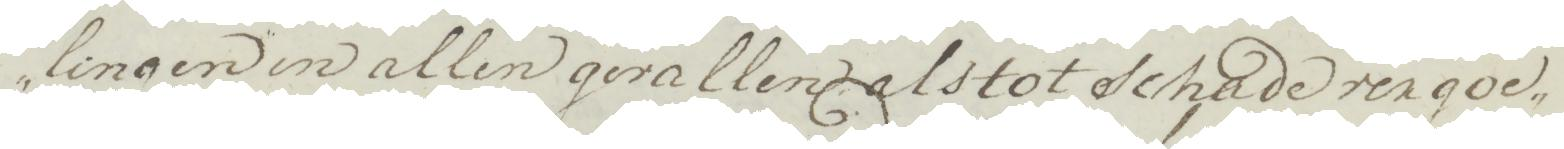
„lingen in allen gevallen als tot schade vergoe„
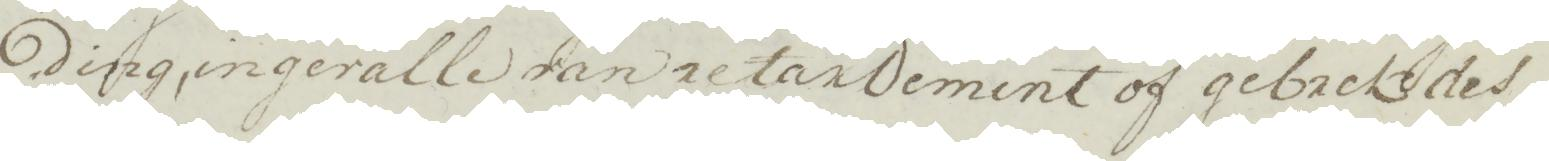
ding, ingevalle van retandement of gebrek des
